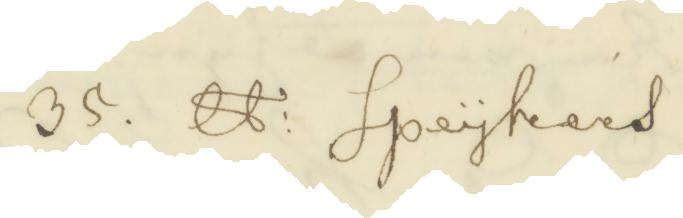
35. lb: speijkers
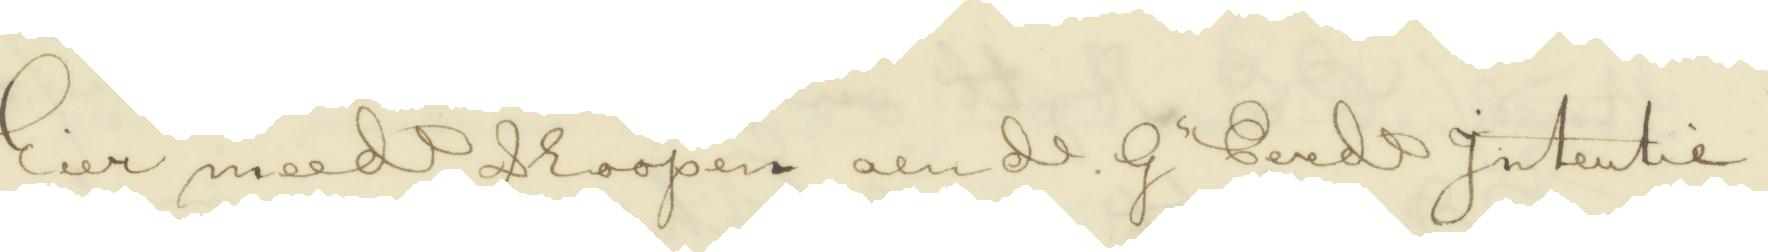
hier meede verhoopen, aen de G'Eerde Jntentie
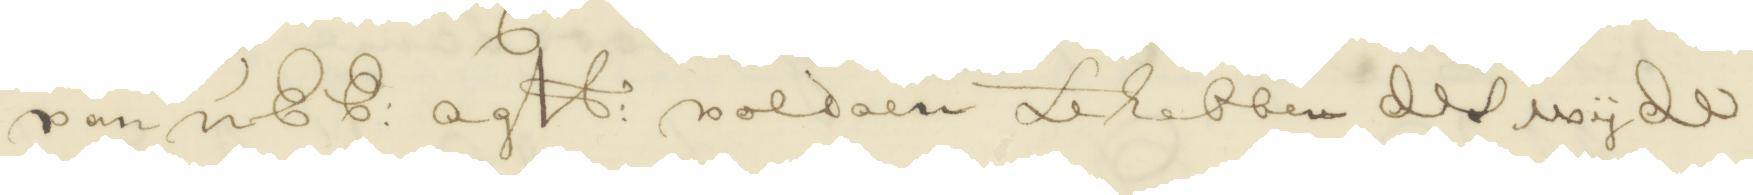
van u E E: agtb: voldaen te hebben, des wij de
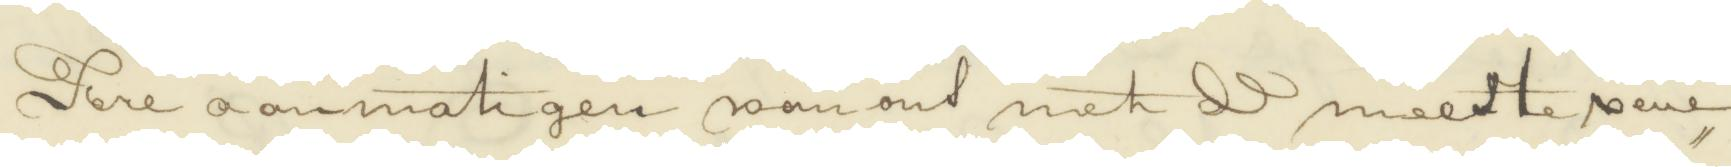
Eere aanmatigen van ons met de meeste vene„
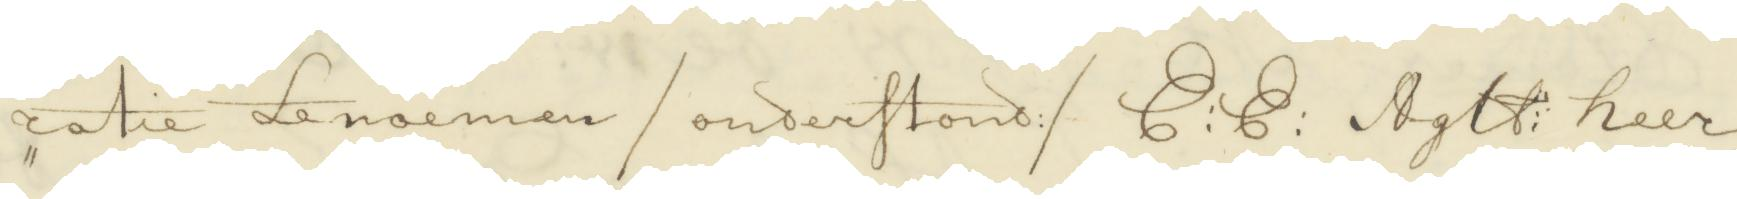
„ratie te noemen /onderstond:/ E: E: Agtb: heer
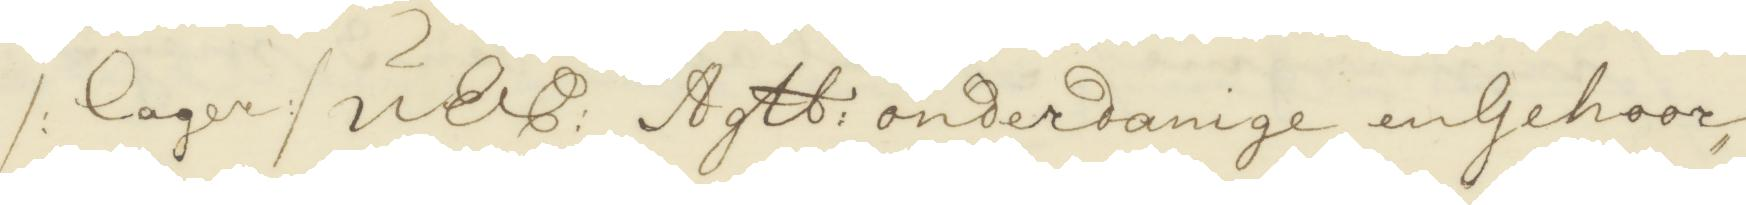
/:lager:/ u E E: Agtb: onderdanige, en Gehoor„
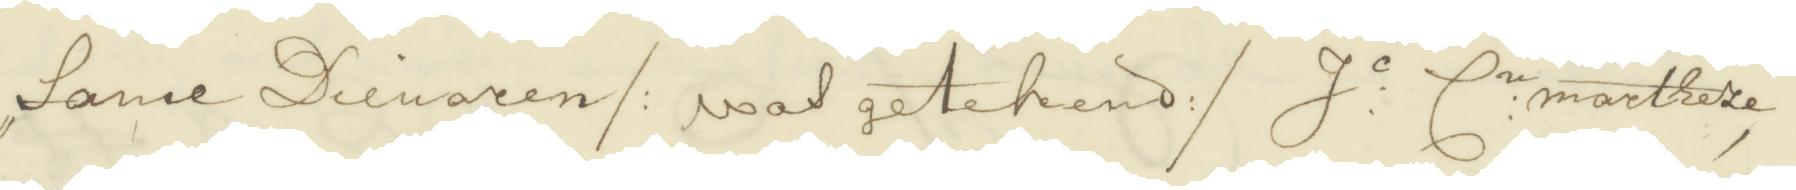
„same Dienaren /: was getekend:/ J:c C:r martheze,
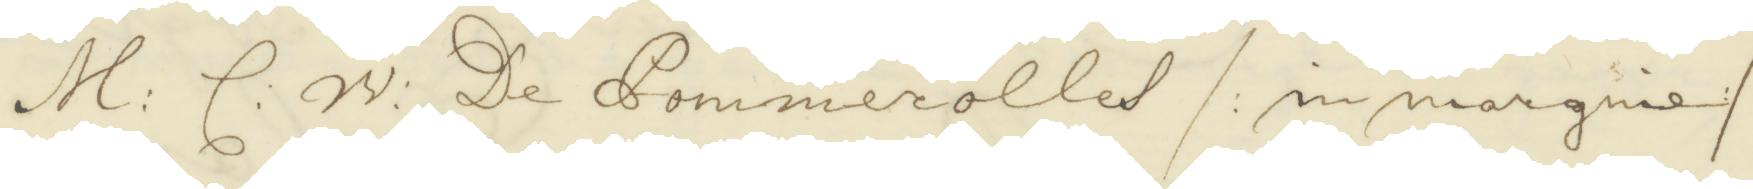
M: C: W: De Pommerolles /:in margine:/
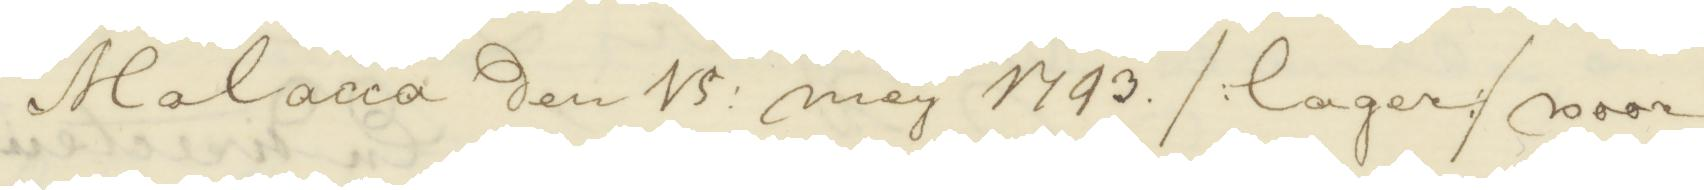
Malacca den 15:' meij 1743. /:lager:/ voor
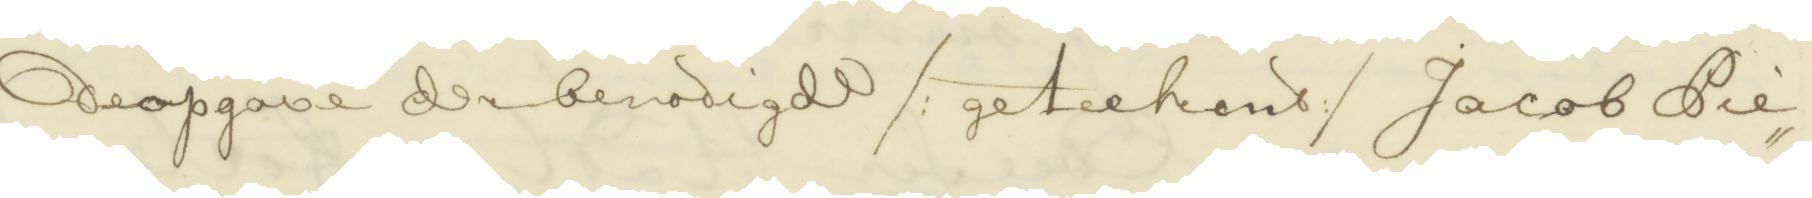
de opgave der benodigde /:geteekend:/ Jacob Pie„
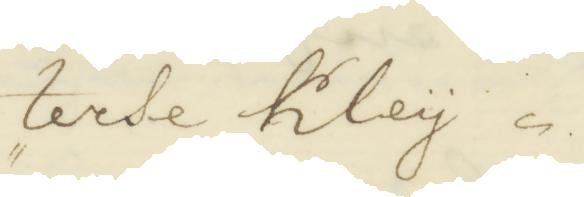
„terse Kleij.
